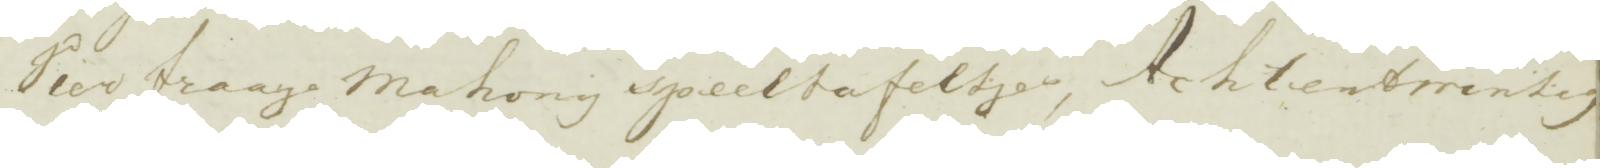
Vier fraaye Mahonij speeltafeltjes, Achtentwintig
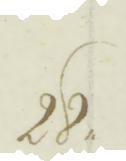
„ 28„
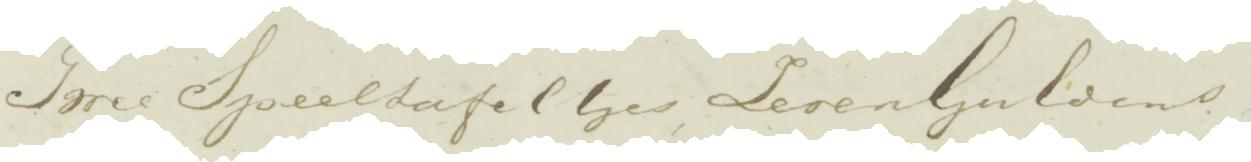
Twee Speeltafeltjes, Zeven Guldens
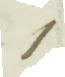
„' 1„
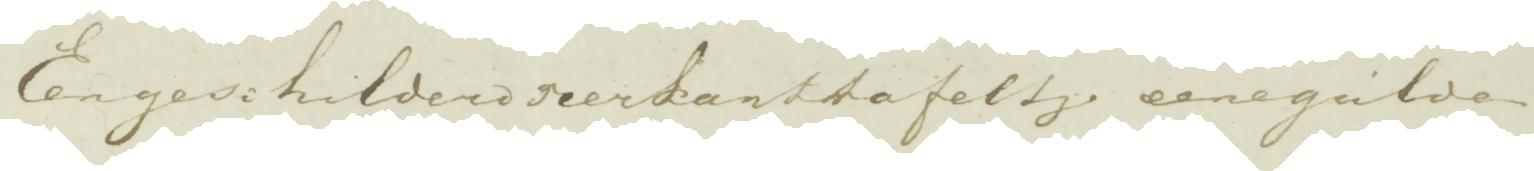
Een geschilderd vierkant tafeltje eenegulden
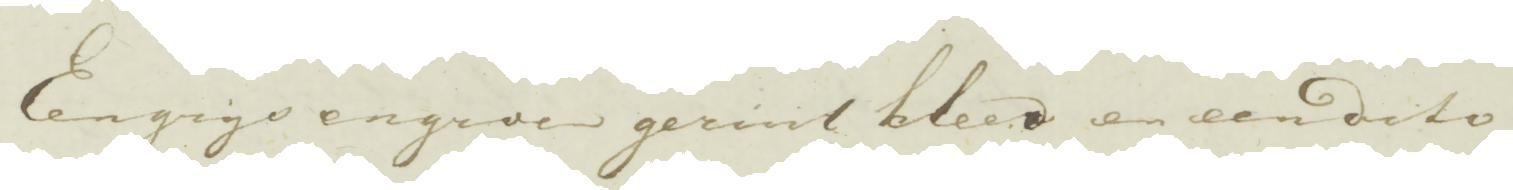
Een grijs en groen geruit kleed en een dito
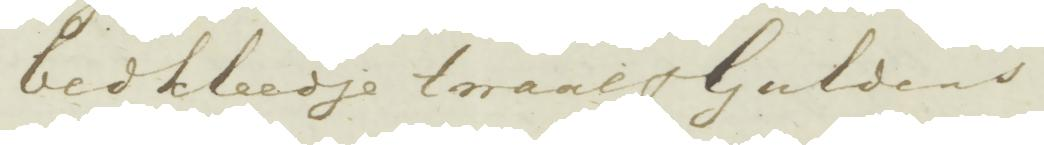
bedkleedje twaalf Guldens
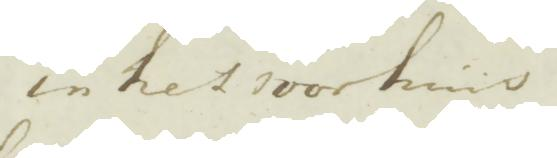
in het voorhuis
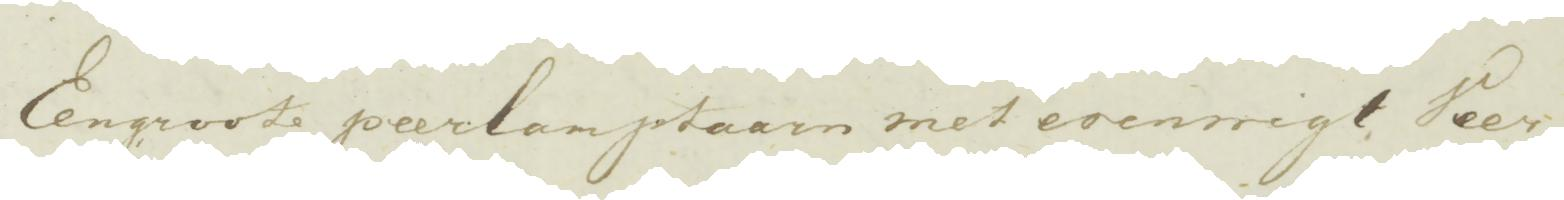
Een groote peerlamptaarn met evenwigt, Veer.
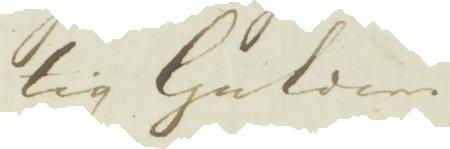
tig Guldens
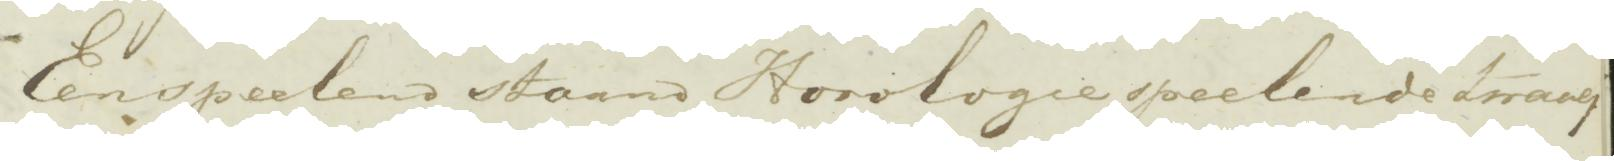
Een speelend staand Horologie speelende twaalf
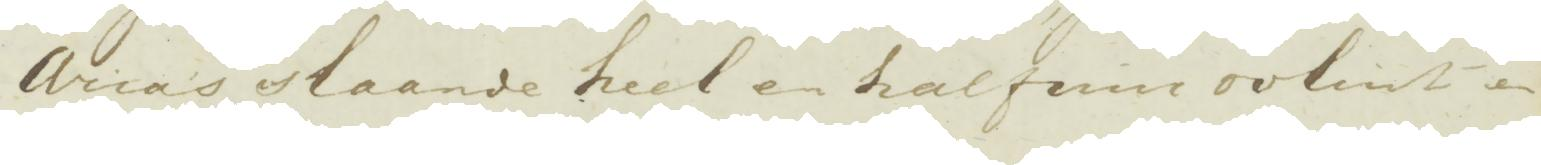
Aria's slaande heel en halfuur ooluit en
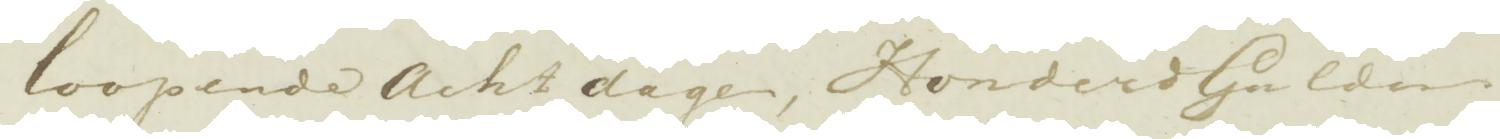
loopende Acht dagen, Honderd Guldens
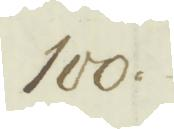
100„
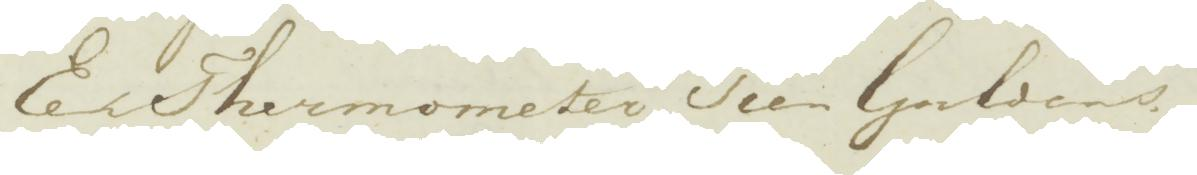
Een Thermometer Tien Guldens.
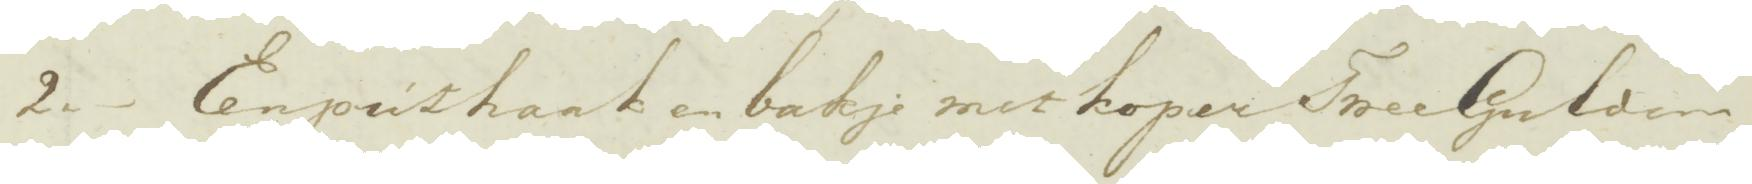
2„ — Een puthaak en bakje met koper Twee Guldens
